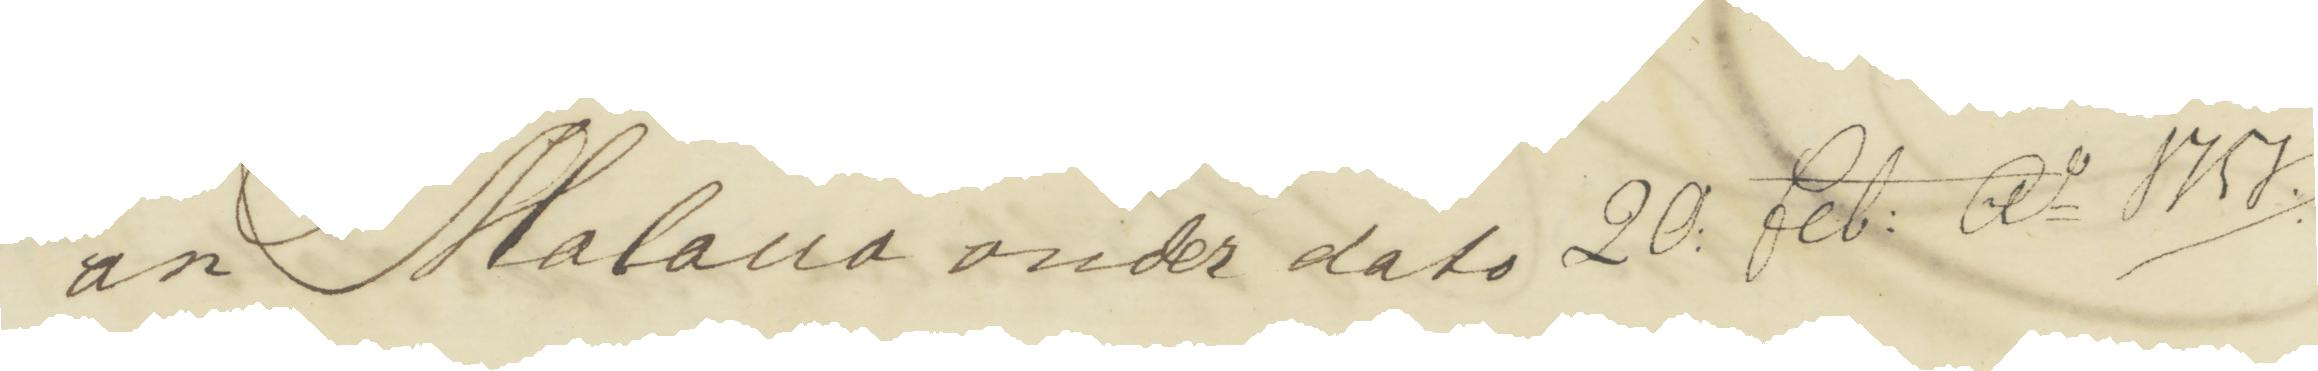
Van Malacca onder dato 20: feb: A=o 1751
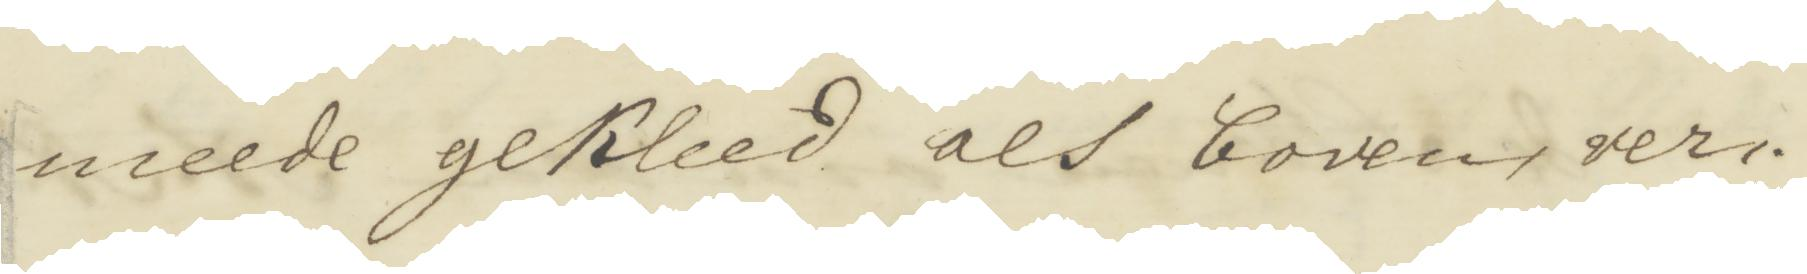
meede gekleed als boven, ver„
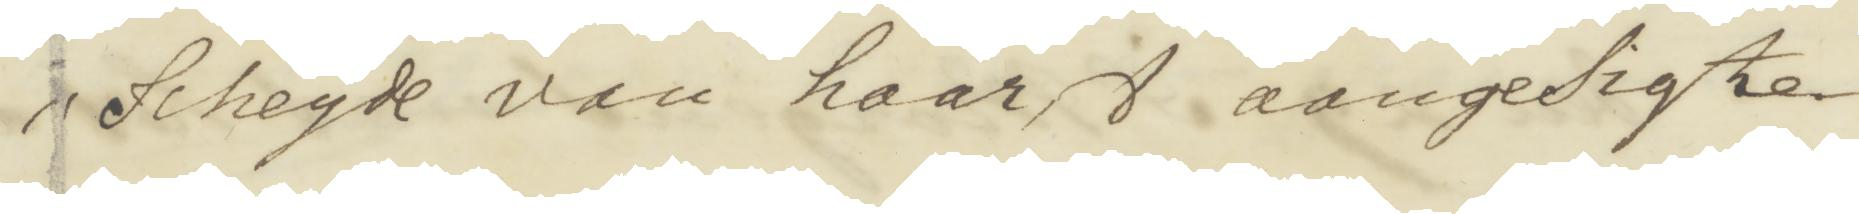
„scheyde van haar, t aangesigte
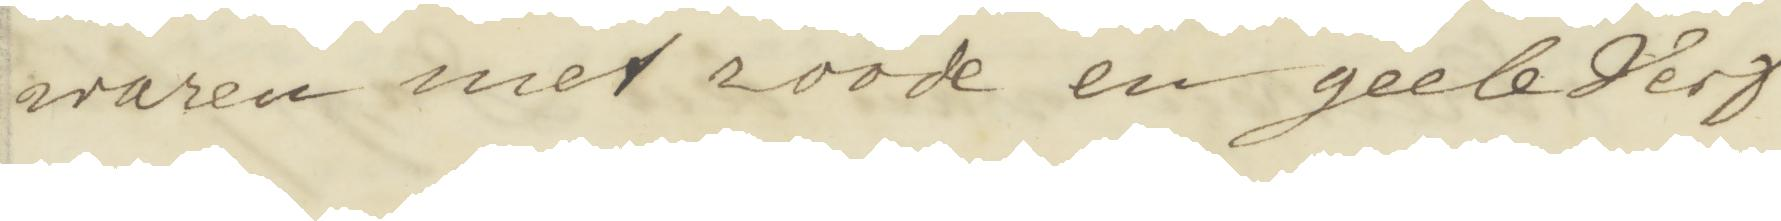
waren met roode en geele verf
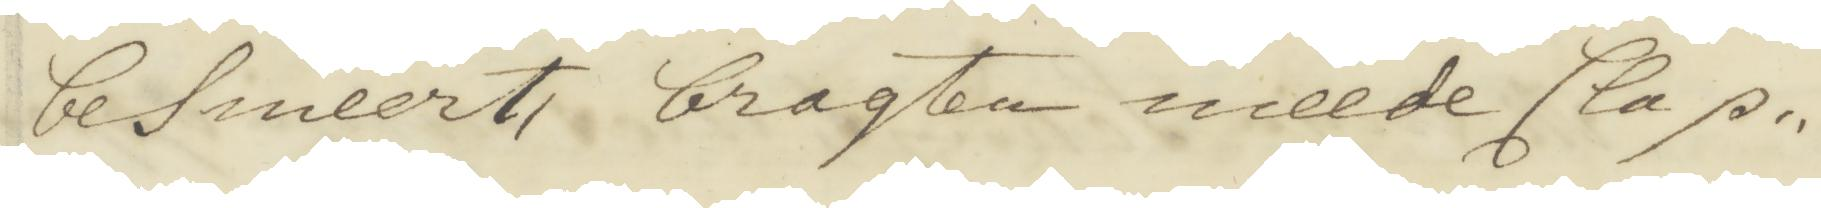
besmeert, bragten meede Clap„
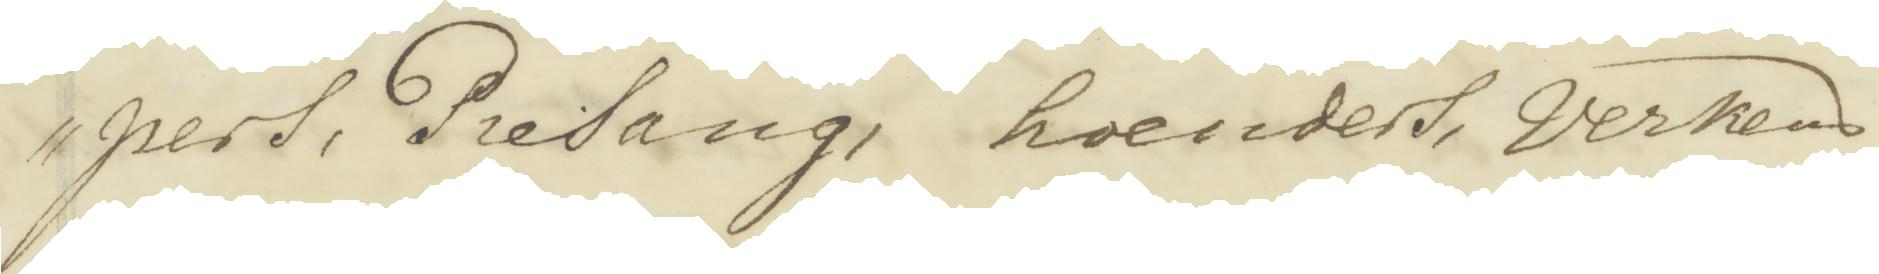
„pers, Piesang, hoenders, verkens
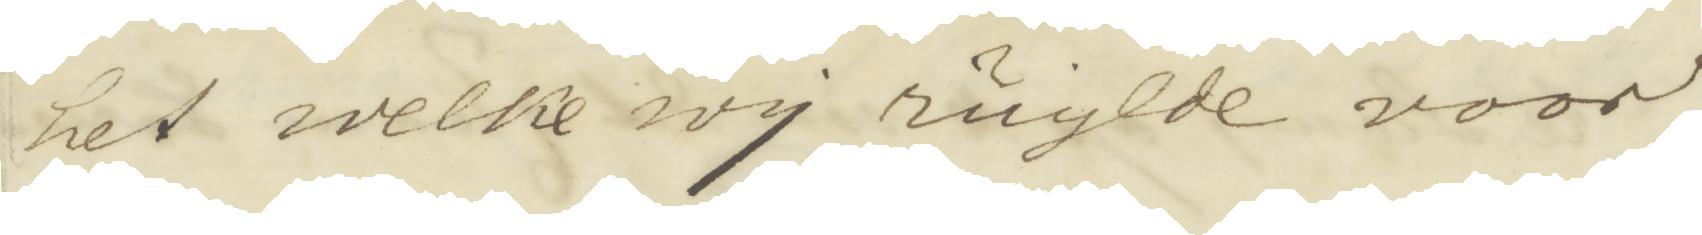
het welke wij ruijlde voor
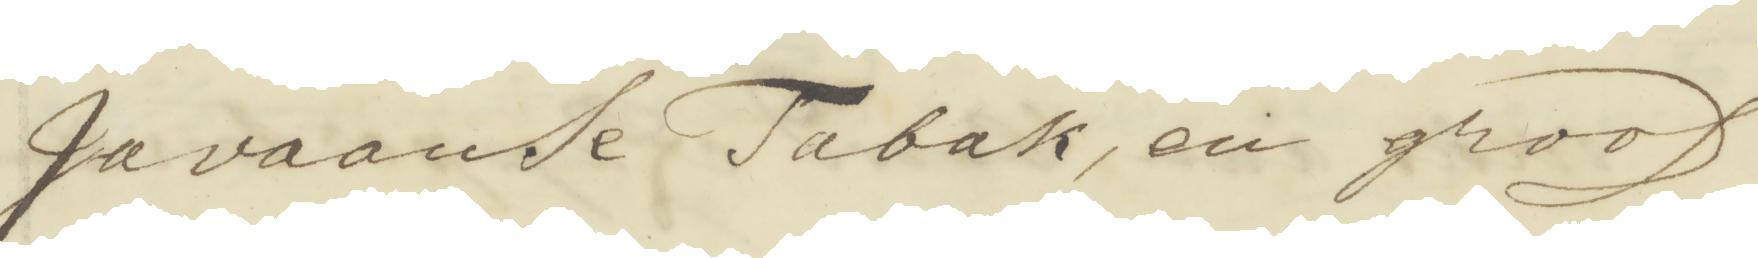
Javaanse Tabak, en groof
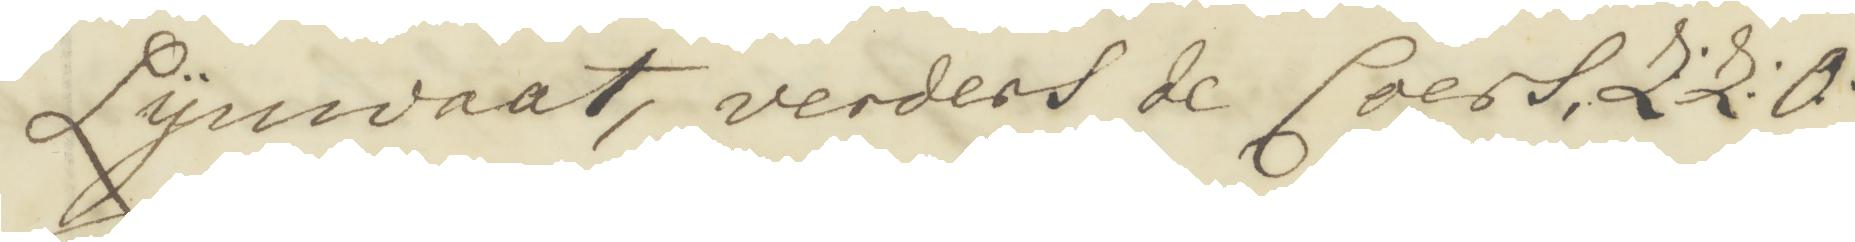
Lijnwaat, verders de Coers, Z:Z:O:
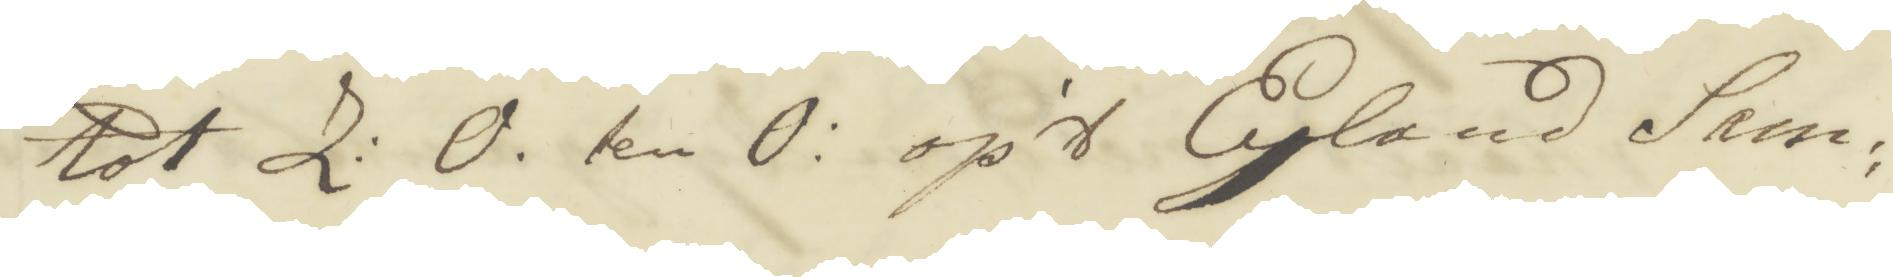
tot Z:O. ten O: op ’t Eyland Sam„
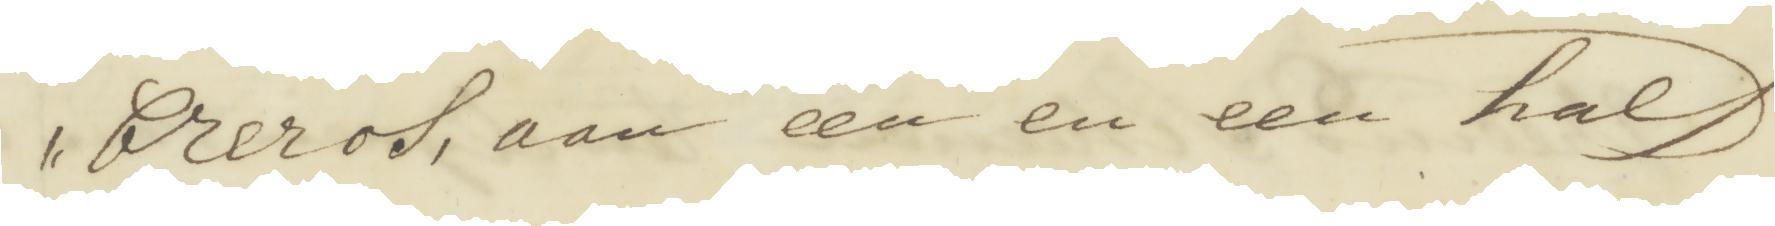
„breros, aan een en een half
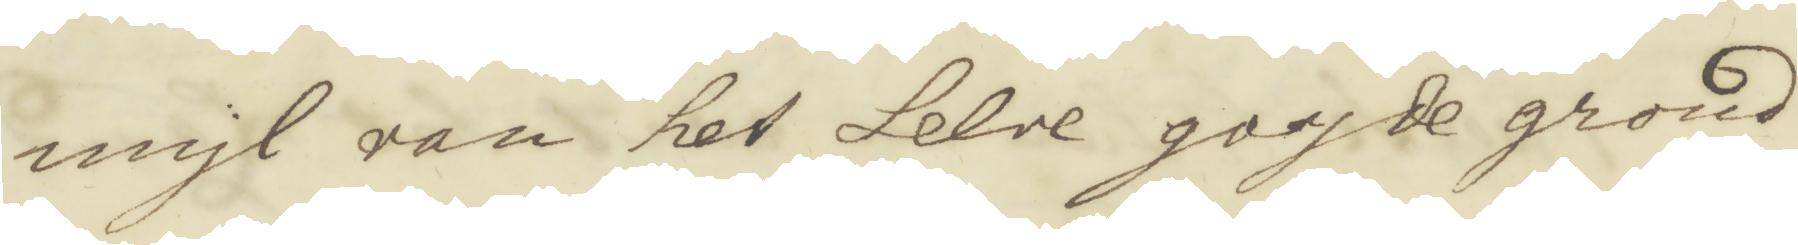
mijl van het selve goyde grond
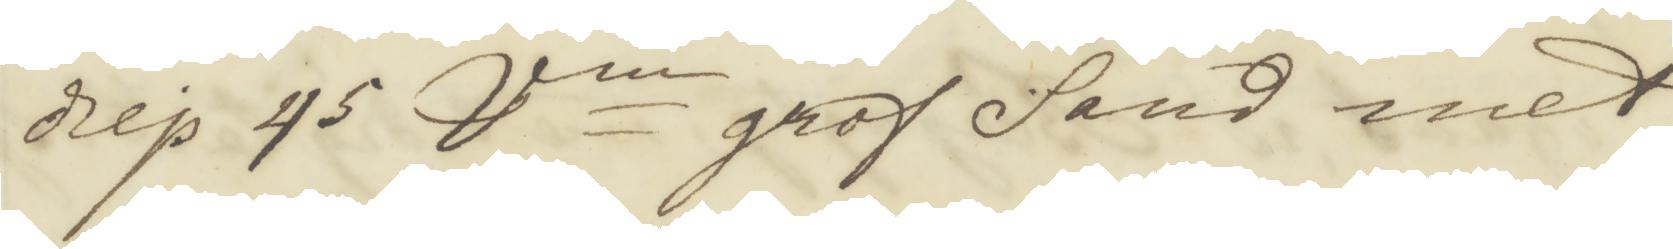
diep 45 v=m grof sand met
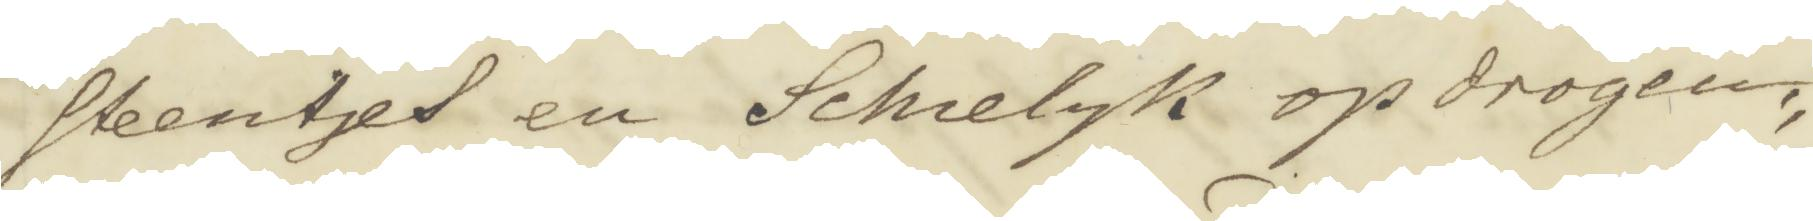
steentjes en schielyk op drogen„
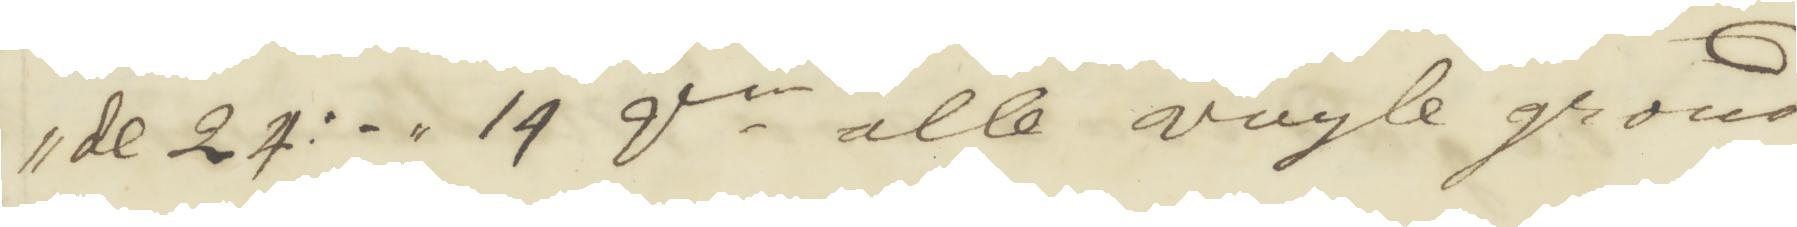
„de 24: - „ 14 v=m alle vuyle grond
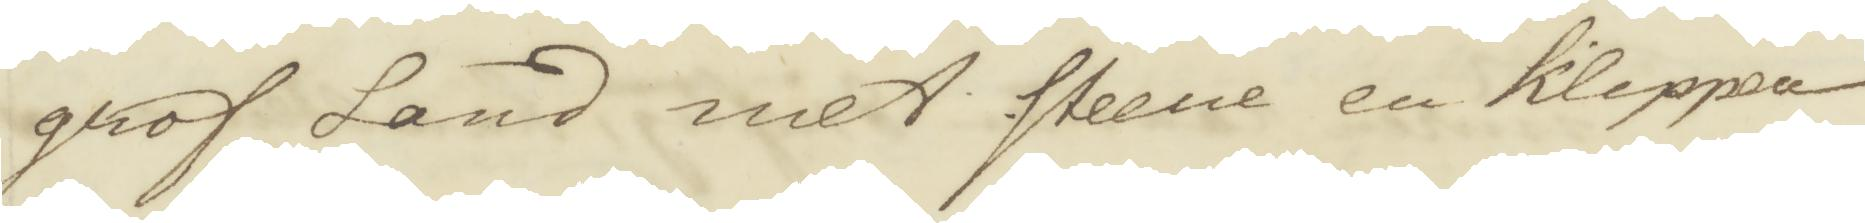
grof land met steene, en klippen
